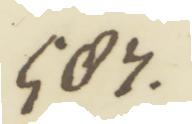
587.
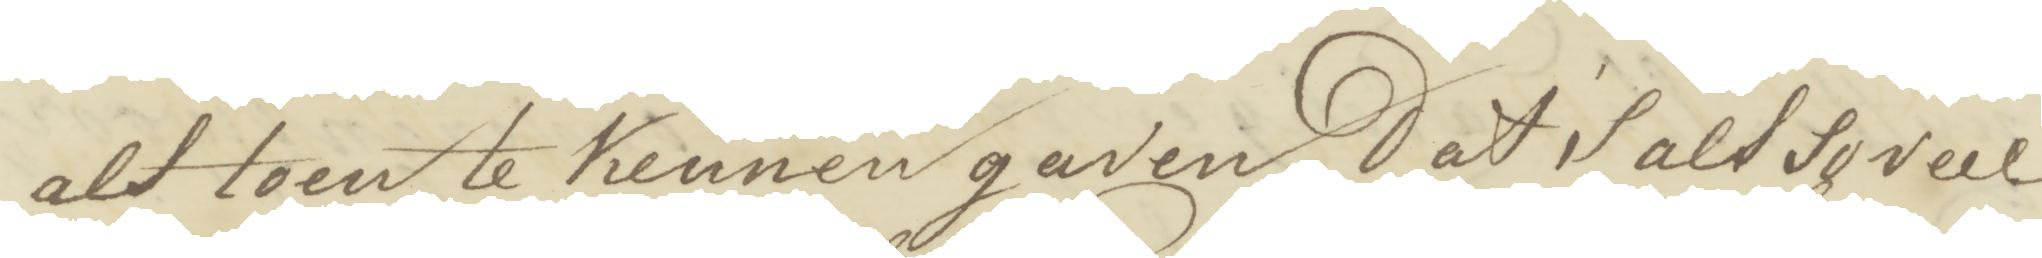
als toen te kennen gaven Dat 'S als soveel
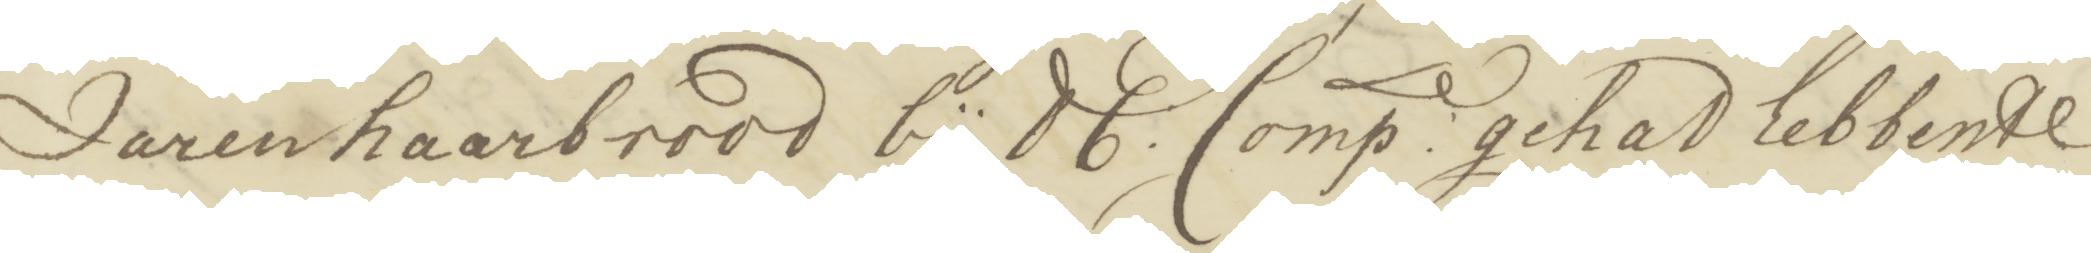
Iaren haar brood bij dE: Comp:e gehad hebbende
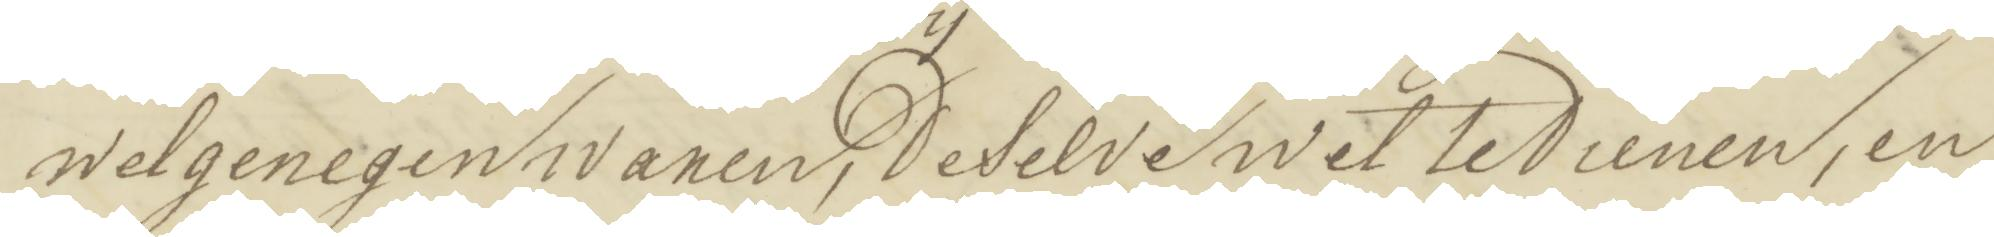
welgenegen waren, Deselve wel te dienen, en
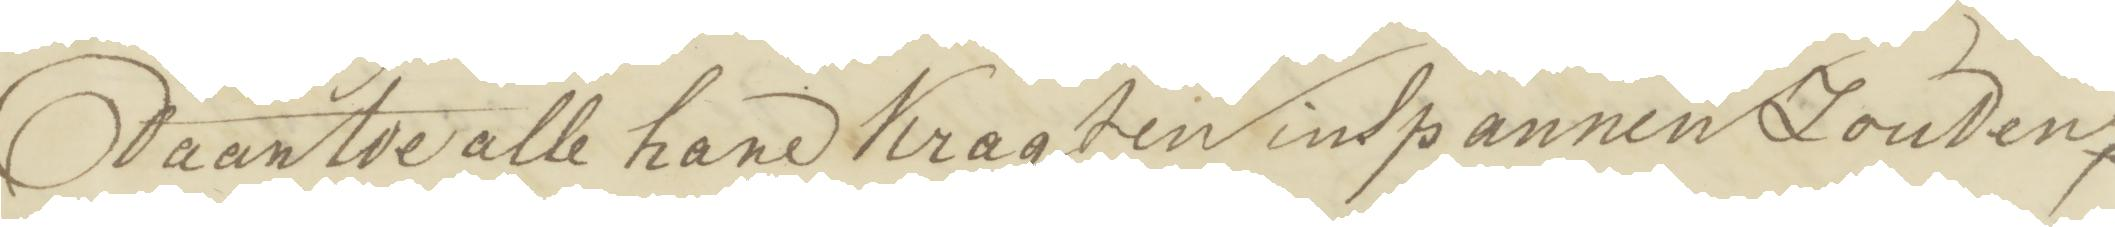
Daar toe alle hare Kragten inspannen Zouden,
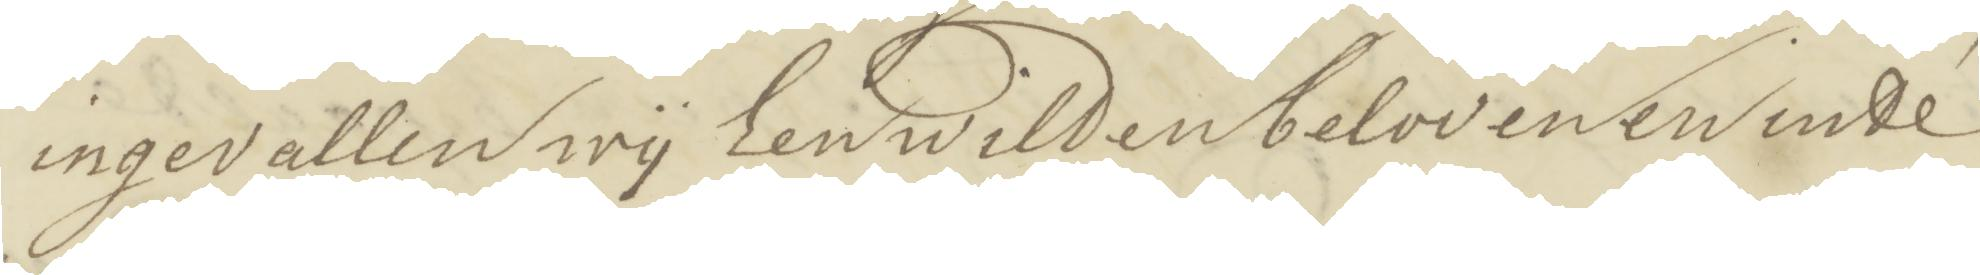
ingevallen wij hen wilden beloven en in de
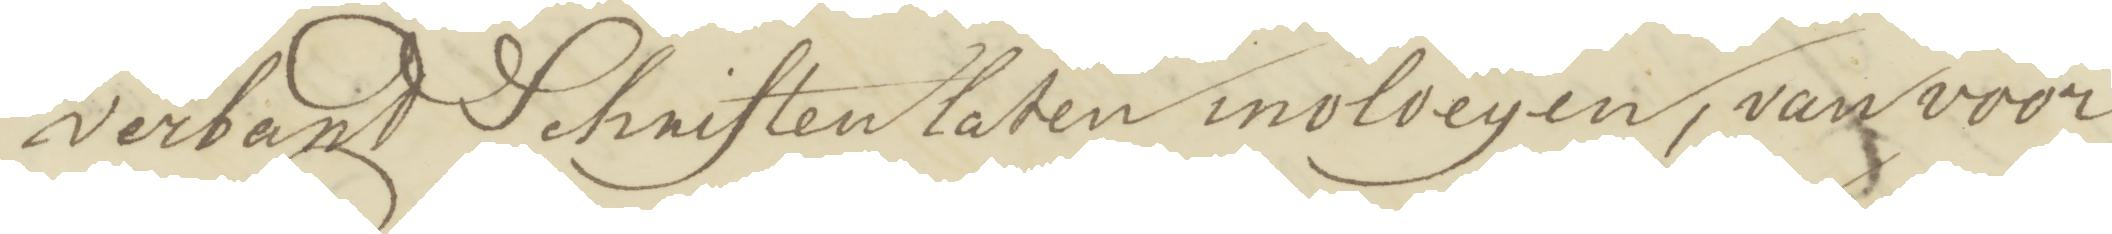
verband Schriften laten invloeijen, van voor
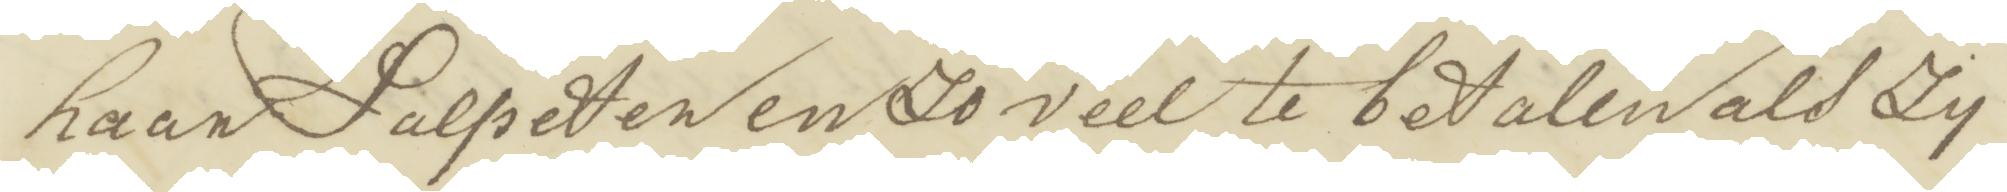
haar Salpeter en Zo veel te betalen als Zij
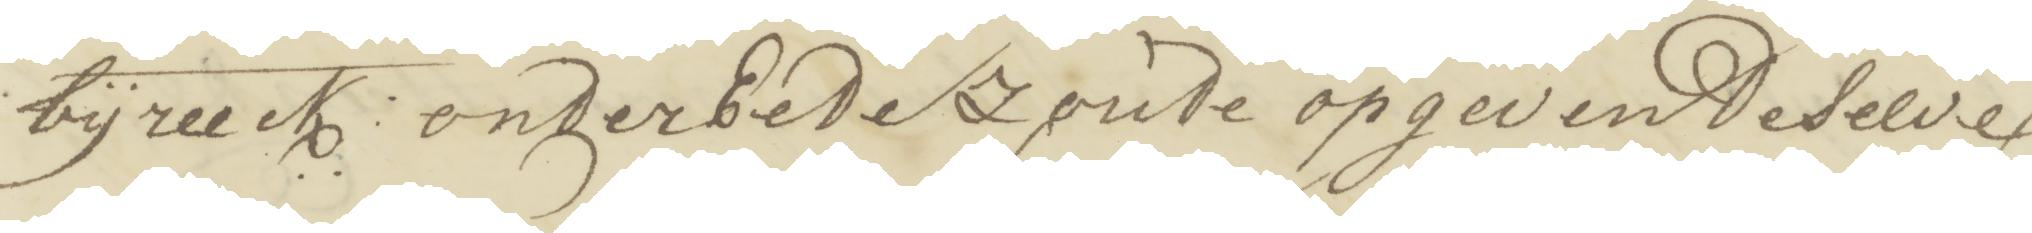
bij reeck: onder Eede Zoude opgeven Deselve
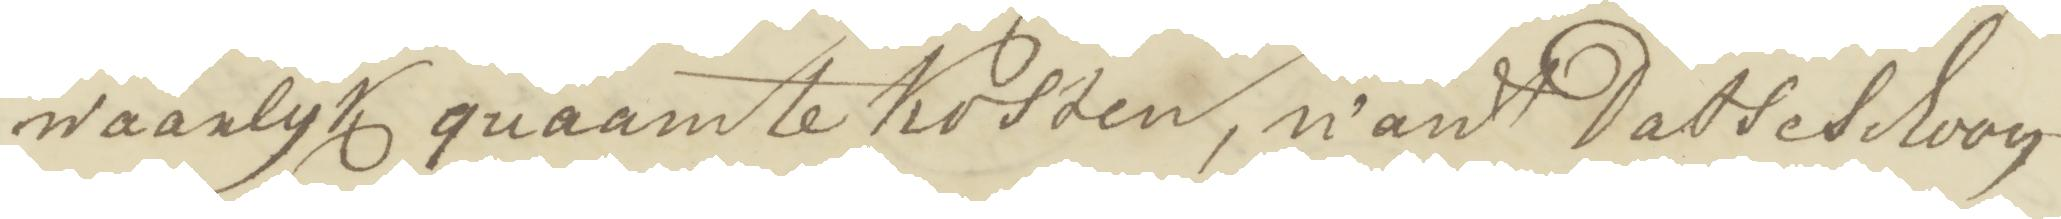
waarlijk quaam te Kosten, want dat Se Schoon
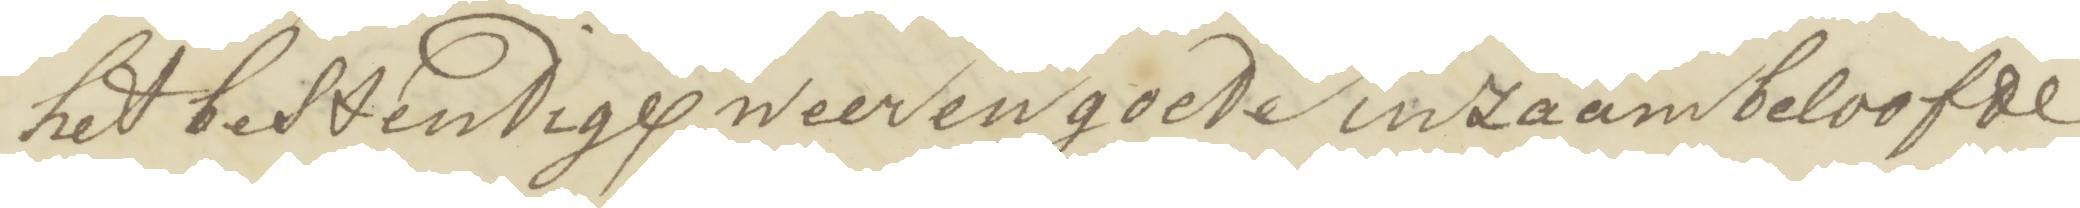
het bestendige weer en goede inzaam beloofde
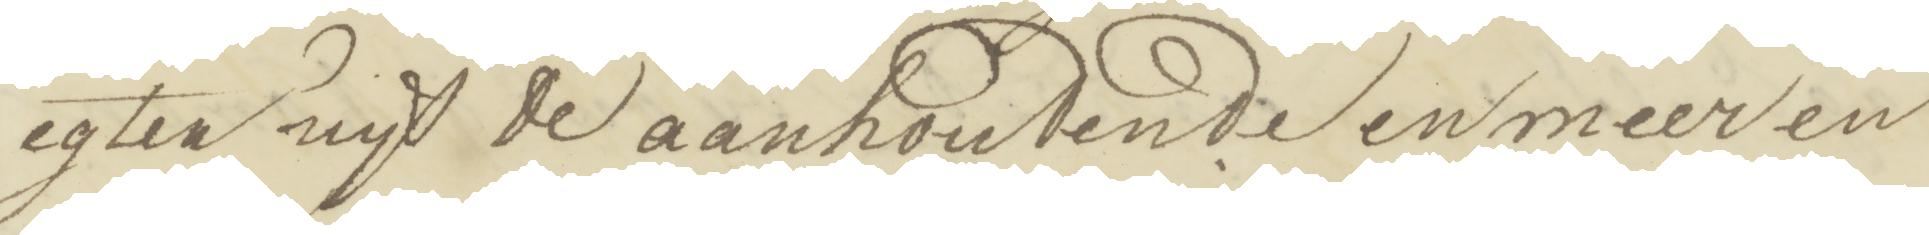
egter uijt de aanhoudende en meer en
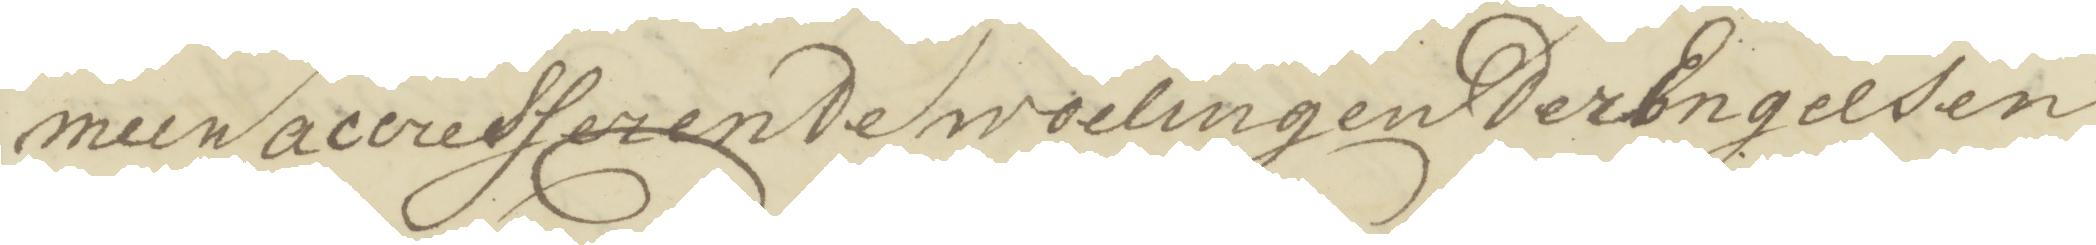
meen accresserende woelingen der Engelsen
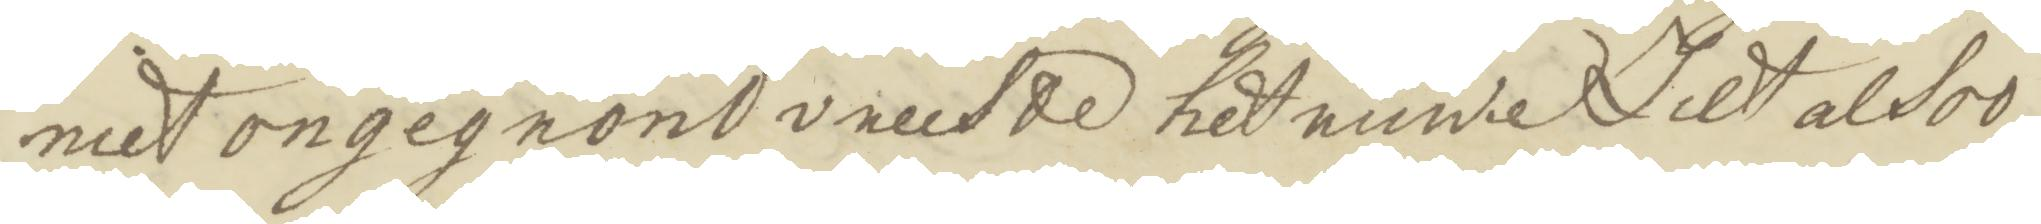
niet ongegrond vreesde het ruwe Zilt alsoo
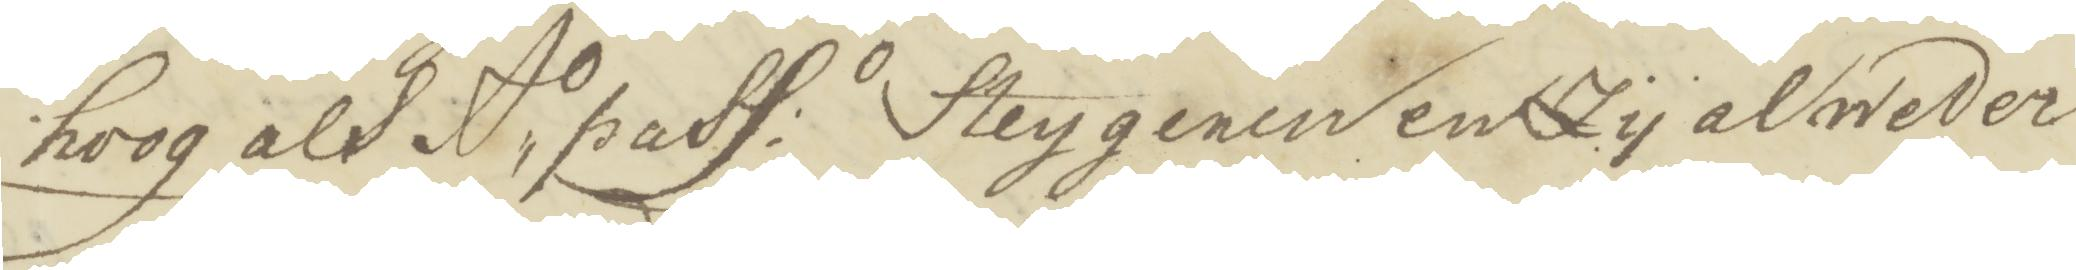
hoog als A„o pass:o Steijgeren en zij al weder
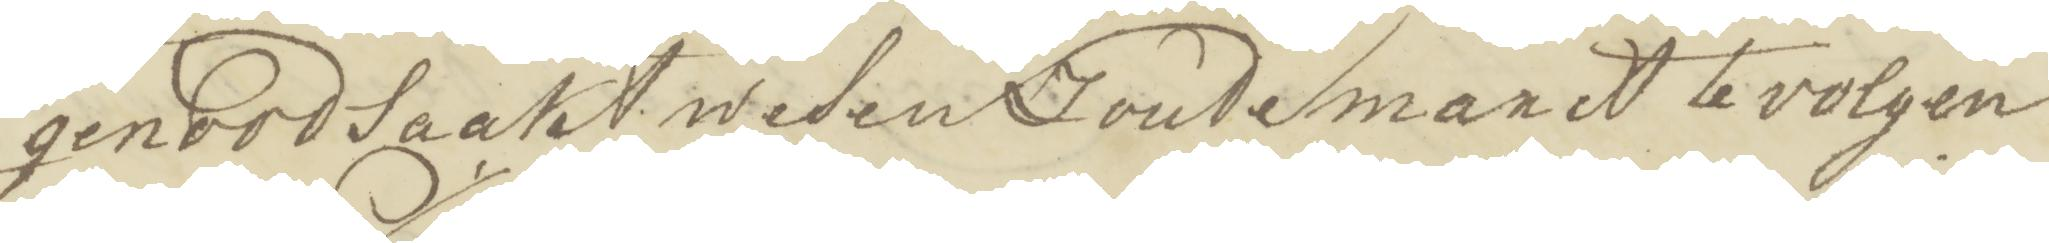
genoodsaakt wesen Zou de marct te volgen
